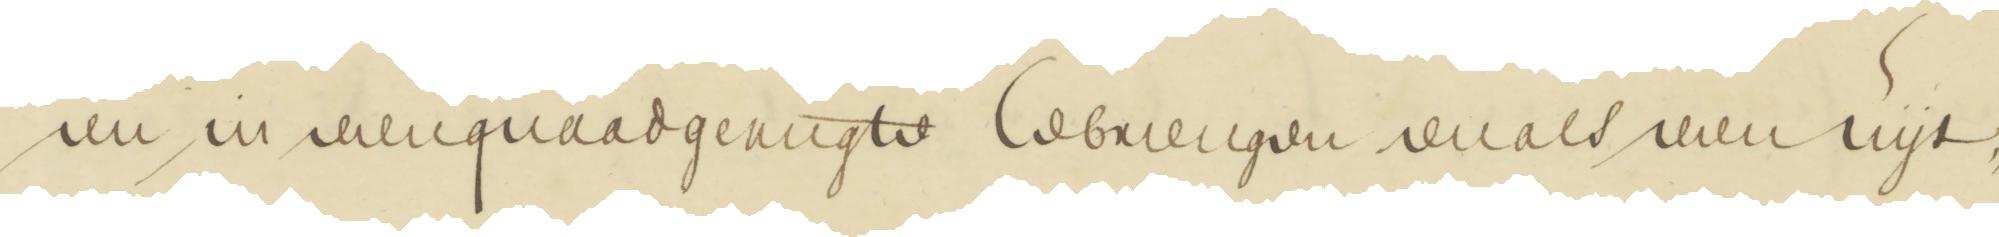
en in een quaadgerugte tebrengen en als een uijt„
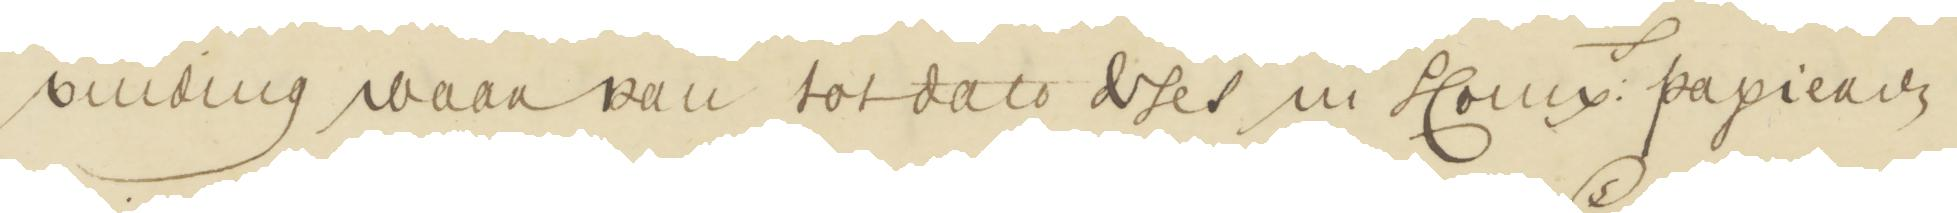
vinding waarvan tot dato deses in sComp:s papieren
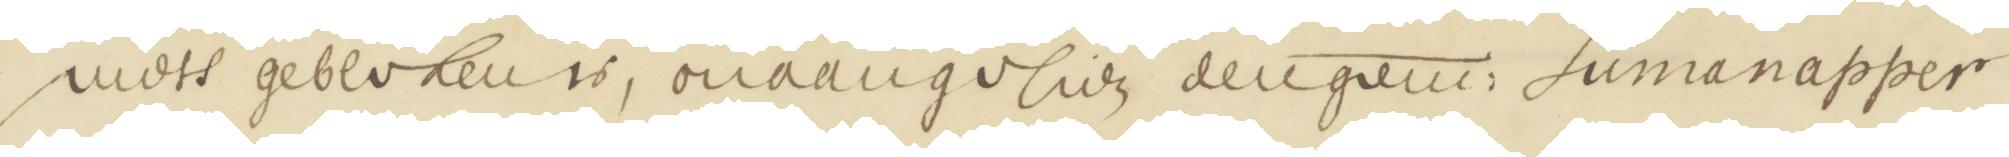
niets gebleken is, onaangesien den gem: Sumanapper
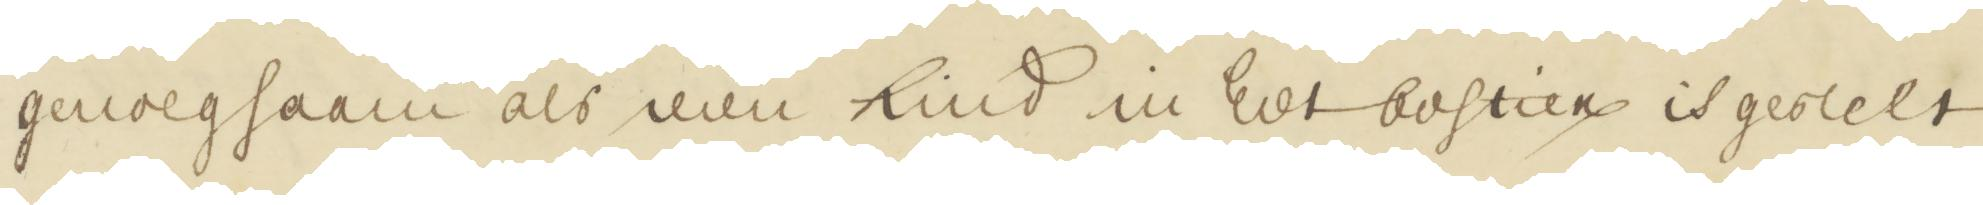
genoegsaam als een kind in het bestier is gestelt
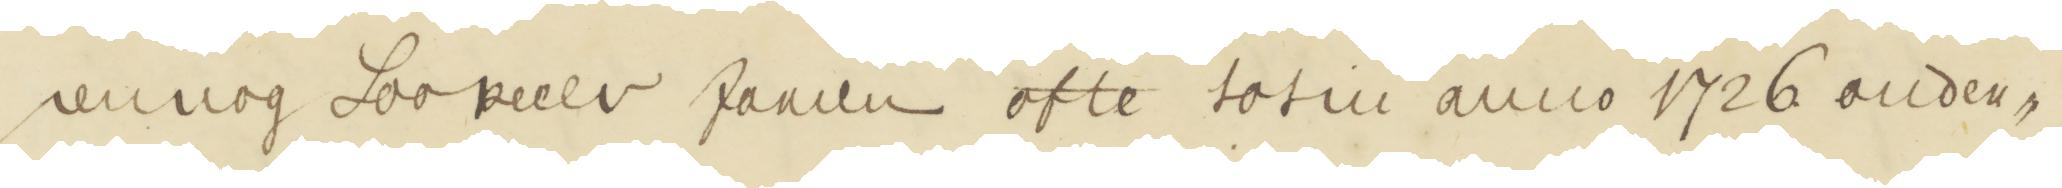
en nog soo veele jaren ofte tot in anno 1726. onder„
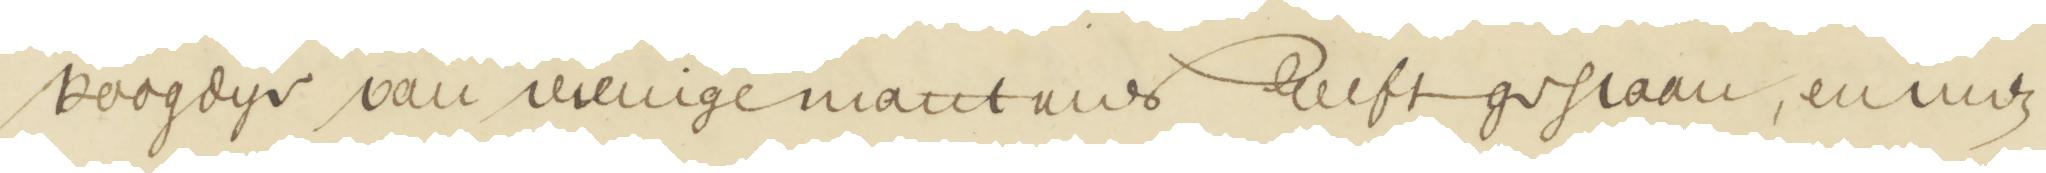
voogdije van eenige mantries heeft gestaan, en men
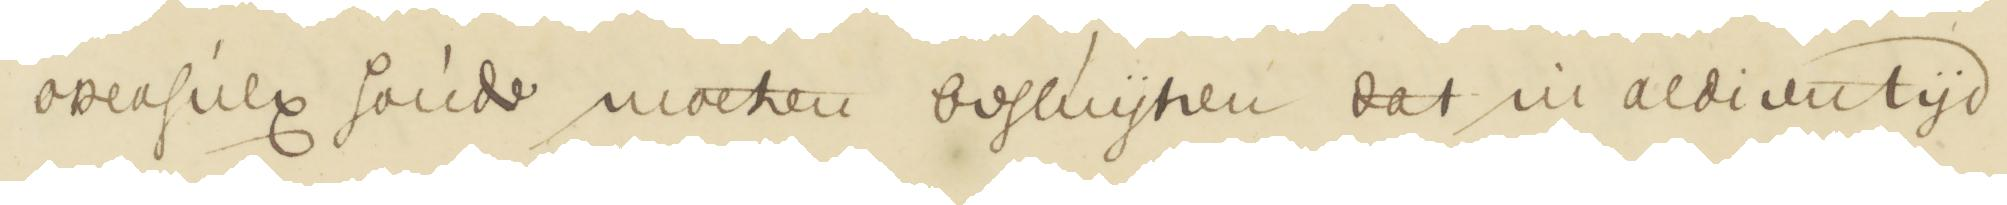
oversulx soude moeten besluijten dat in aldien tijd
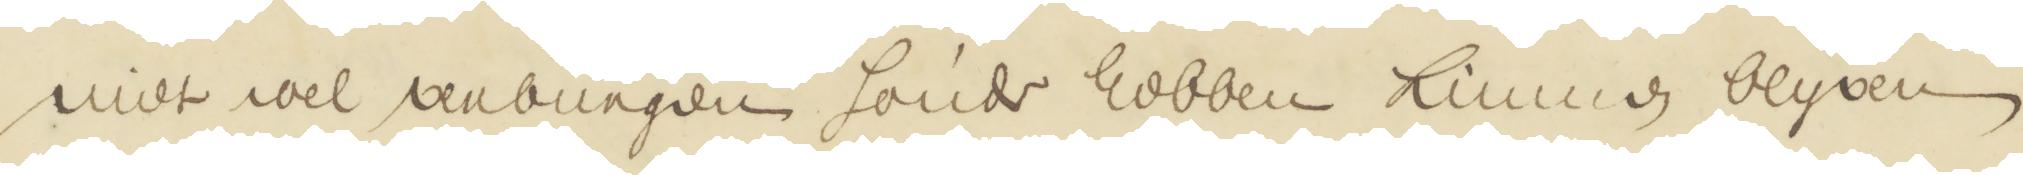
niet wel verburgen soude hebben kunnen blijven
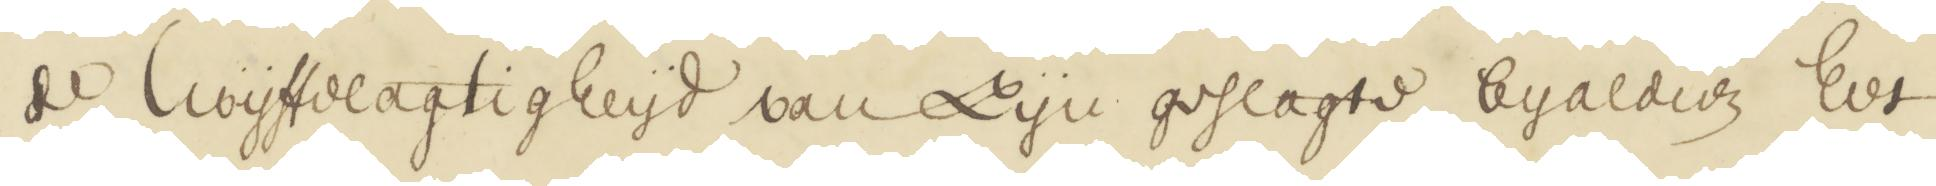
de twijffelagtigheijd van zijn geslagte by aldien het
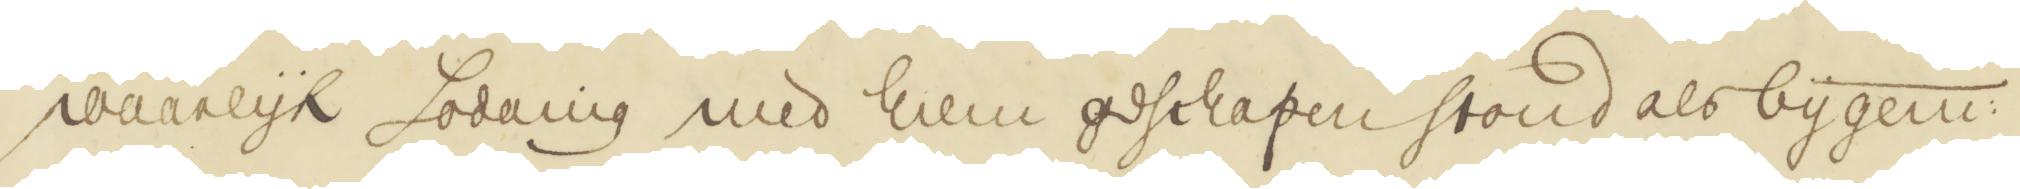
waarlijk sodanig med hem geschapen stond als bij gem:
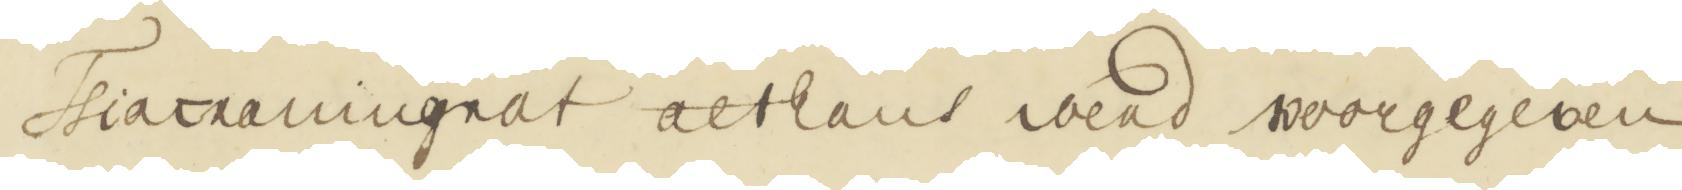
Tsiacraningrat althans werd voorgegeven
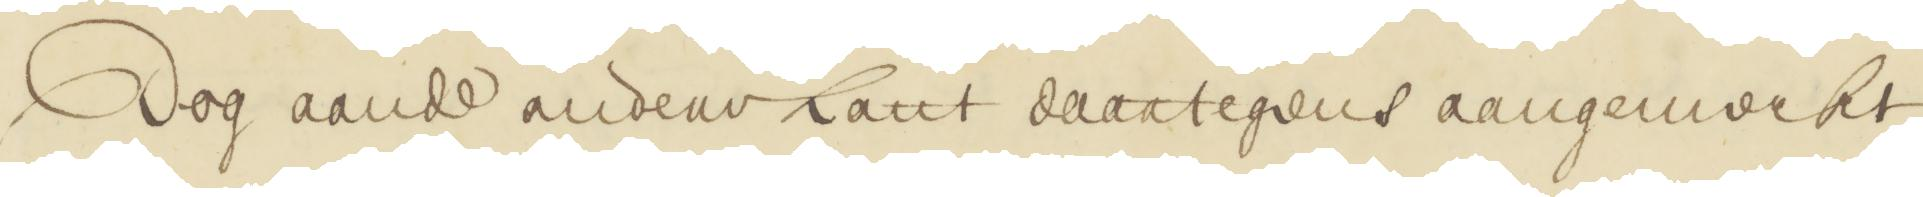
Dog aan de andere kant daartegens aangemerkt
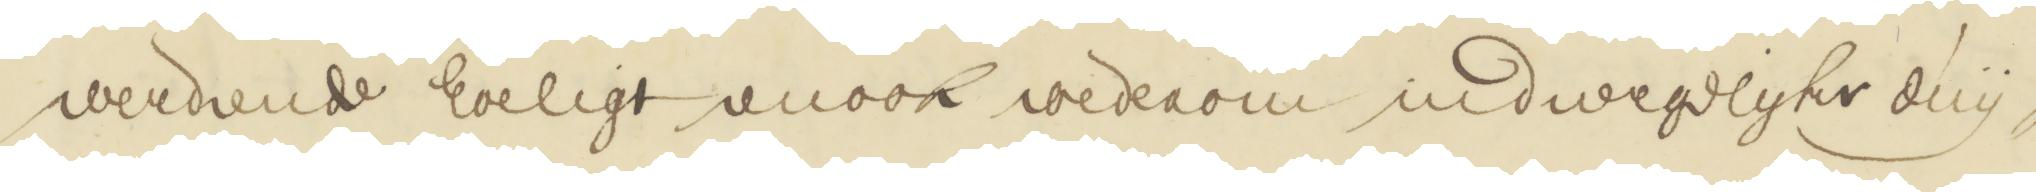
werdende hoe ligt en ook wederom in diergelijke duij„
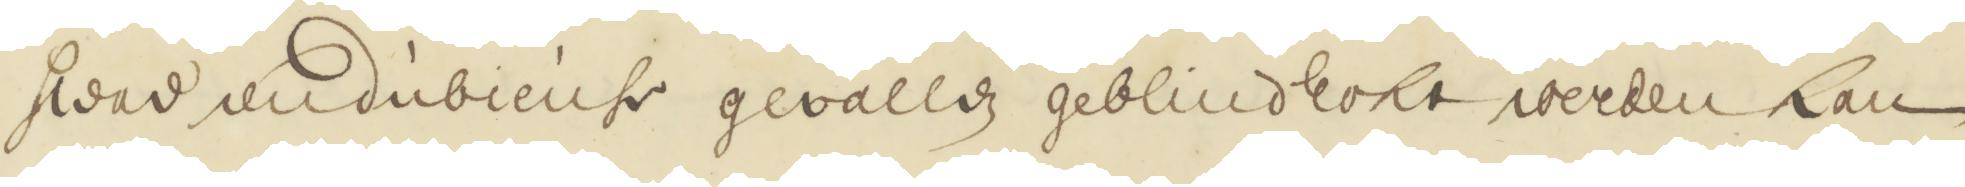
stere en dubieuse gevallen geblindhokt werden kan,
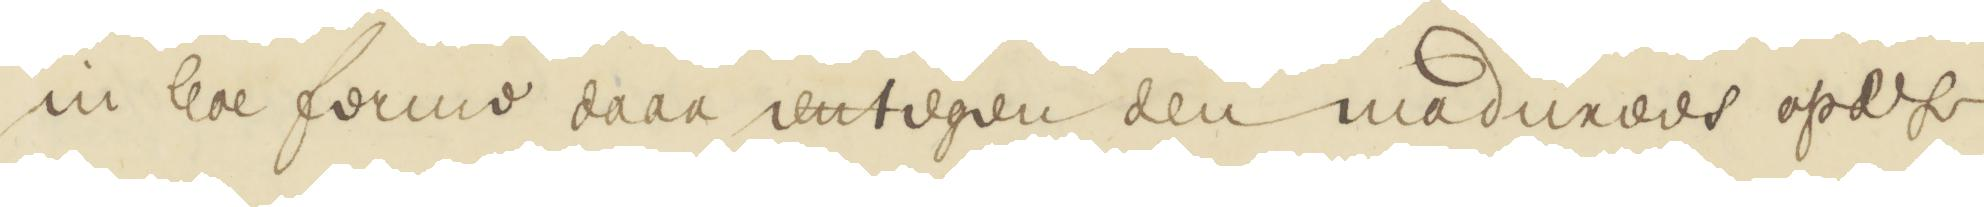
in hoe ferme daar entegen den madurees op dese
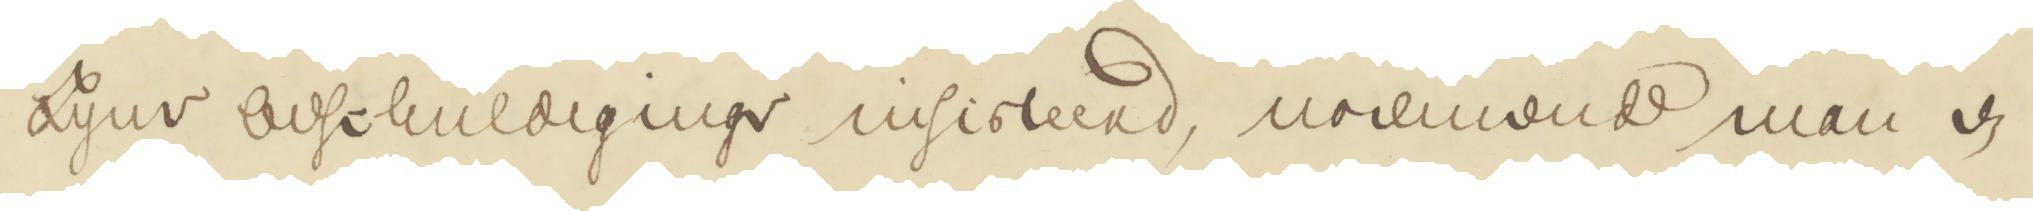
zijne beschuldiginge insisteerd, noemende man en
